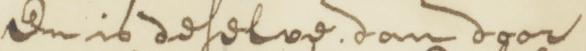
En is deselve dan door
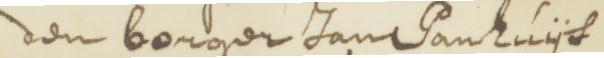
den borger Ian Panhuijs
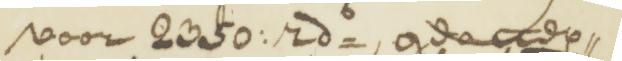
voor 2350: rd=s, geaccep„
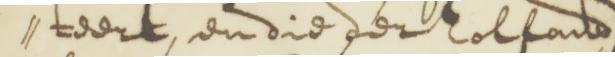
„teert, en die der holland
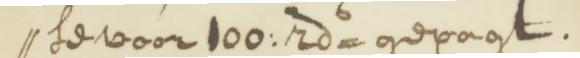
„Se voor 100: rd=s gepagt.
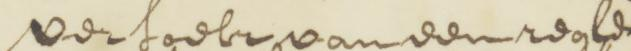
versoek van een regle„
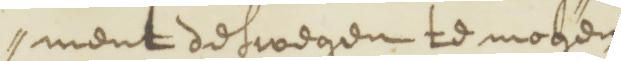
„ment deswegen te mogen
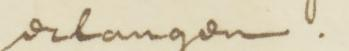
erlangen.
